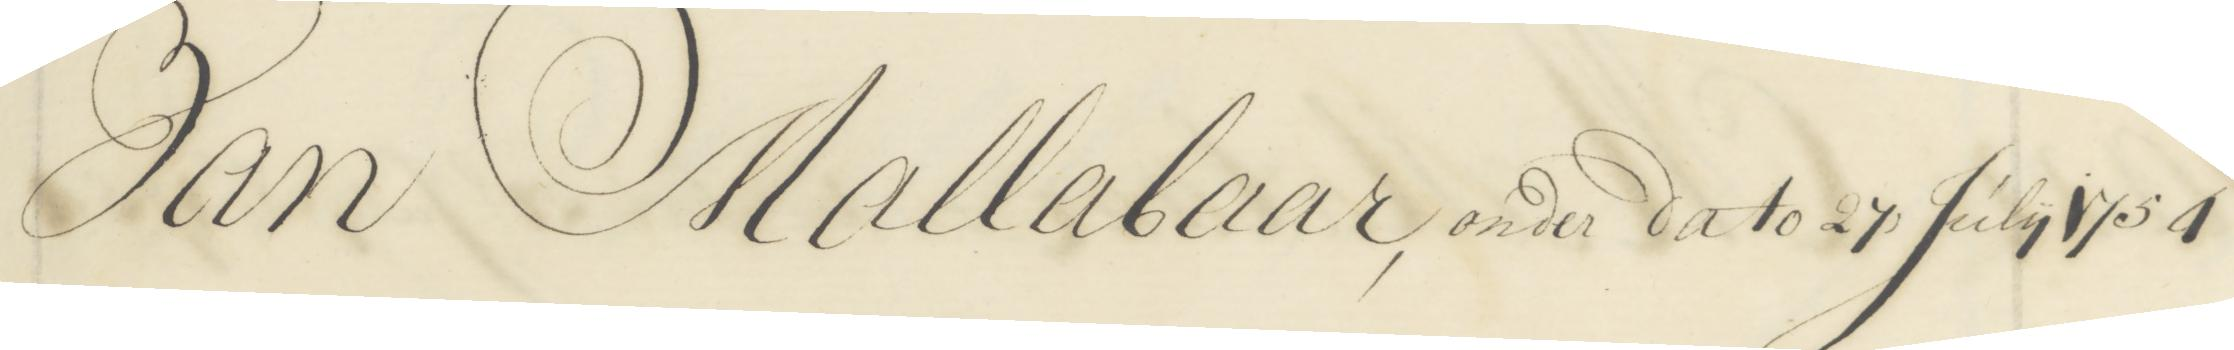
Van Mallabaar, onder dato 27: Julij 1754
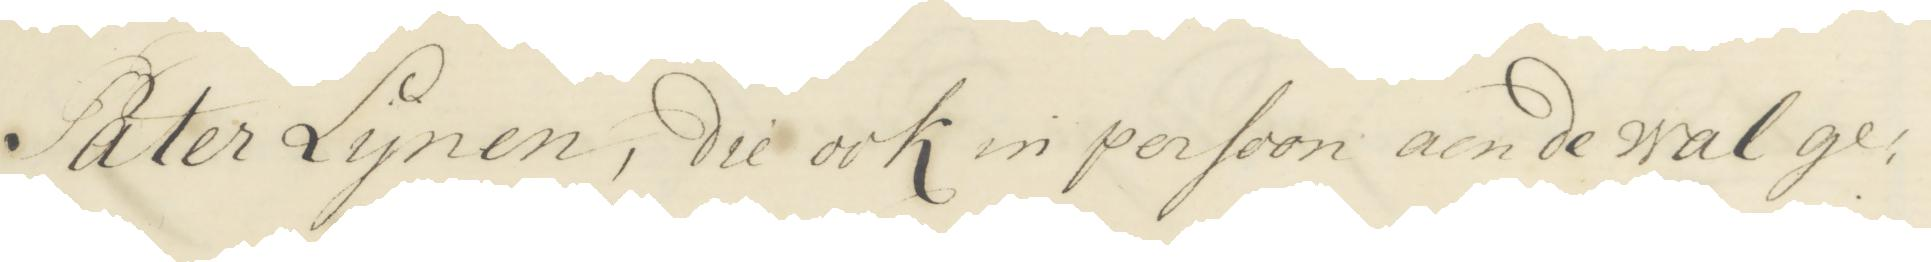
Pater Lijnen, die ook in persoon aen de wal ge„
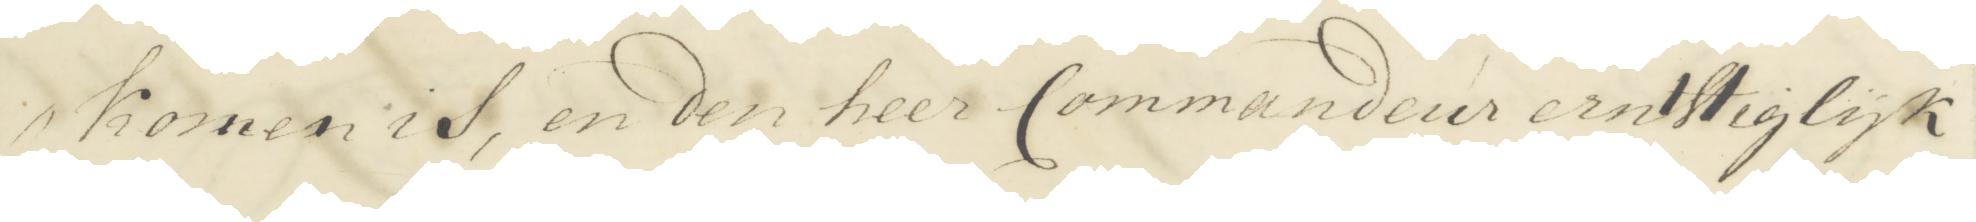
„komen is, en den heer Commandeur erntstiglijk
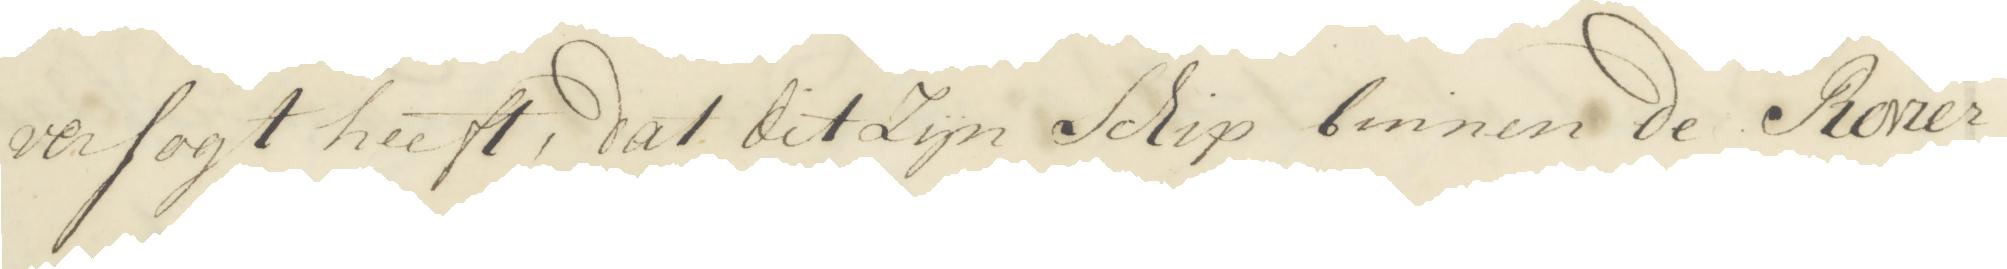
versogt heeft, dat dit zijn schip binnen de Revier
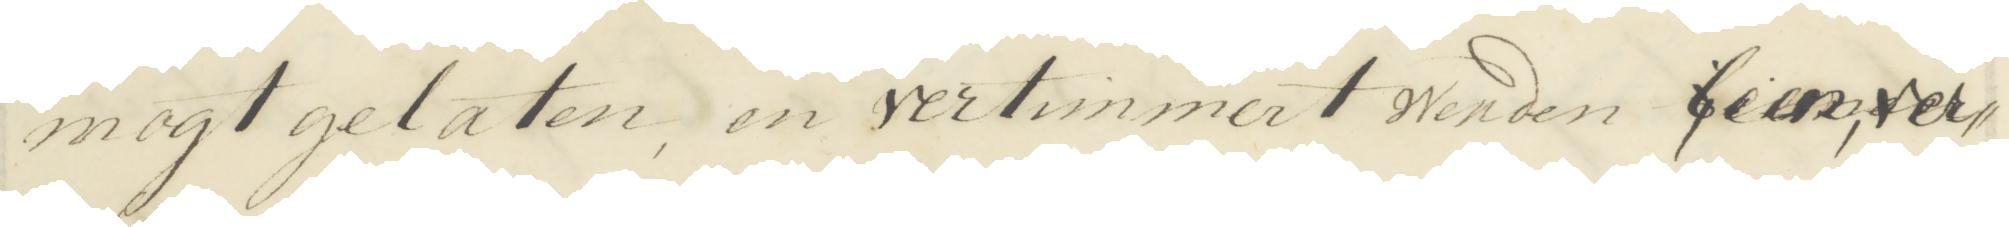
mogt gelaten, en vertimmert werden been, ver„
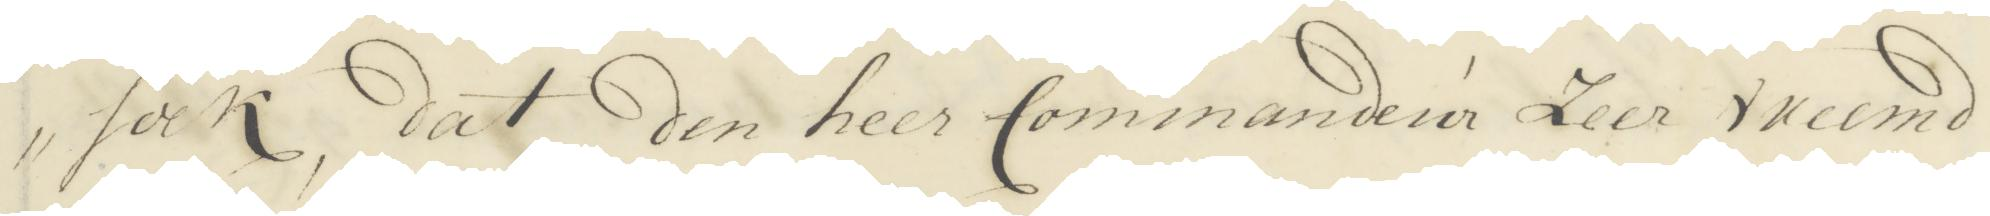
„soek, dat den heer Commandeur zeer vreemd
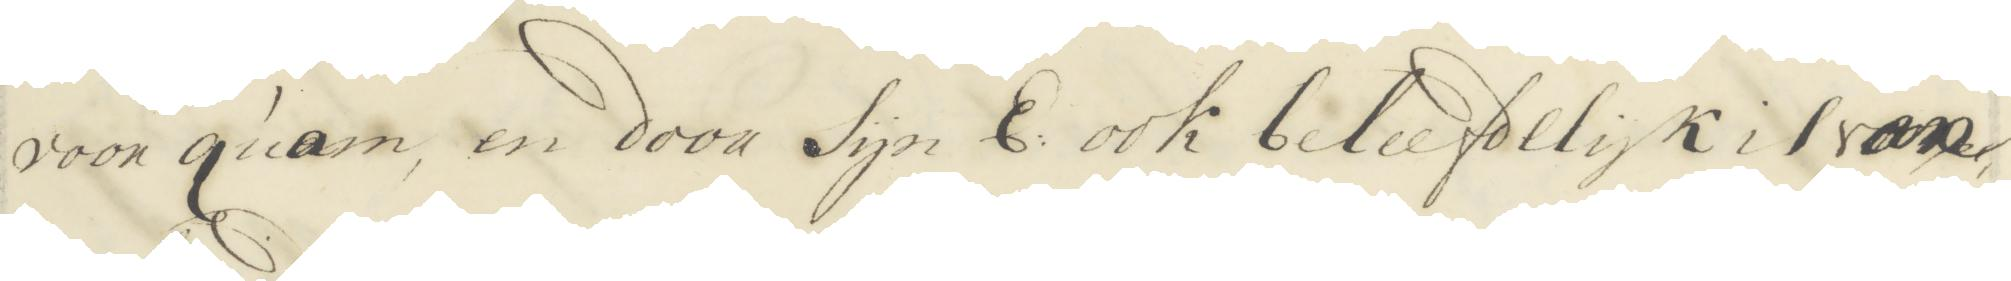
voor quam, en door sijn E: ook beleefdelijk is van
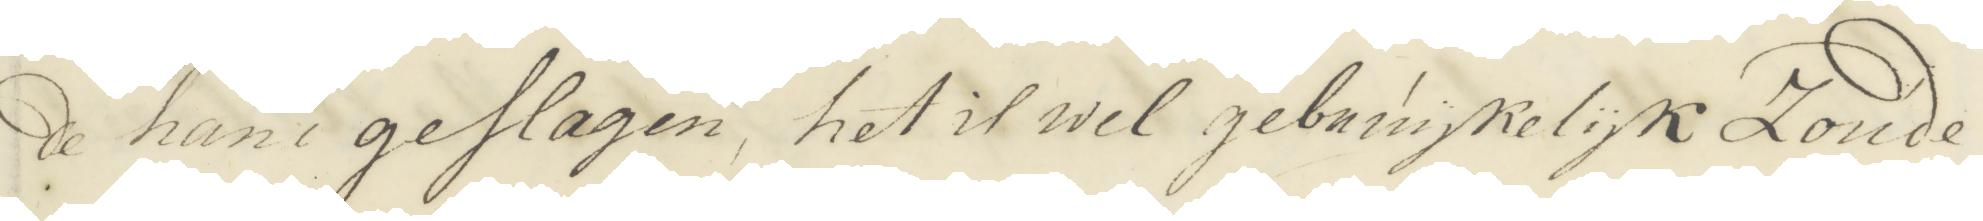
de hand geslagen, het is wel gebruijkelijk zoude
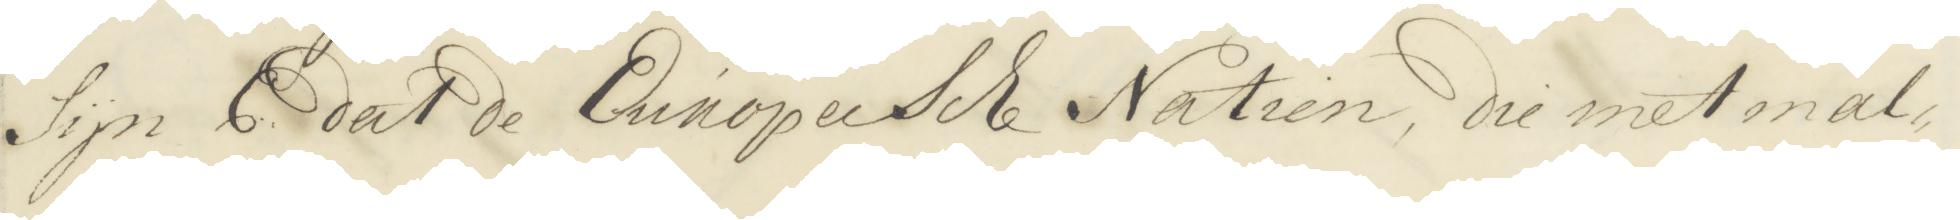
sijn E: dat de Europeesche Natien, die met mal„
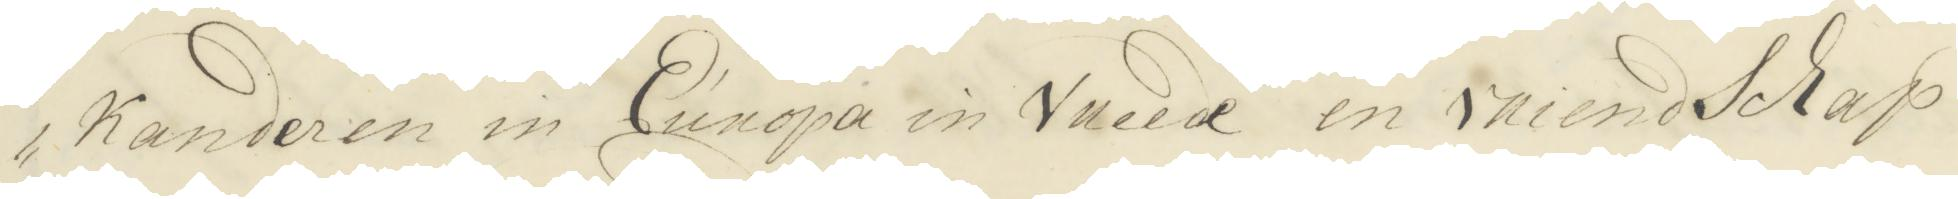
„kanderen in Europa in vreede en vriendschap
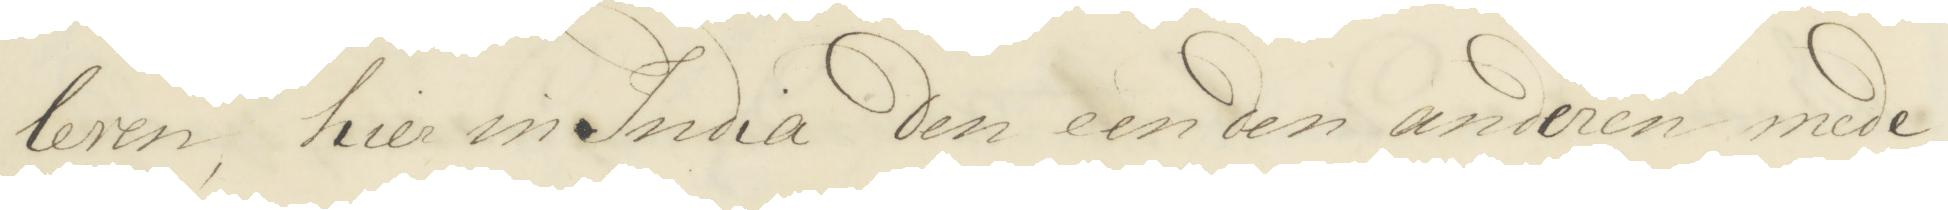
leven, hier in India den een den anderen mede
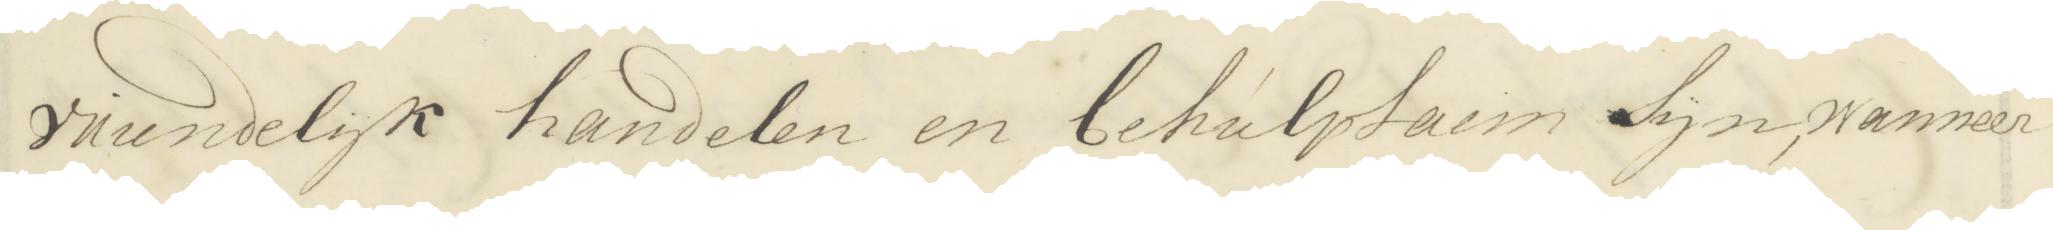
vriendelijk handelen en behulpsaem sijn, wanneer
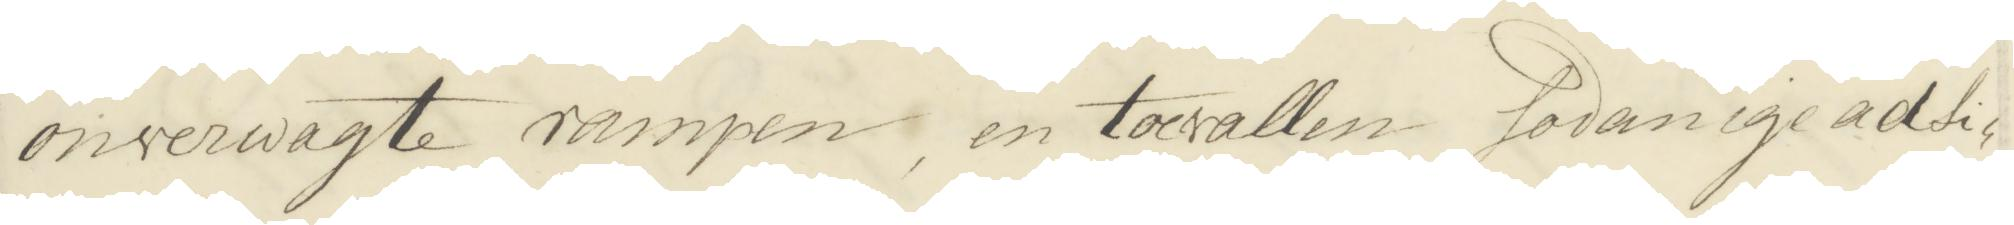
onverwagte rampen, en toevallen sodanige adsi„
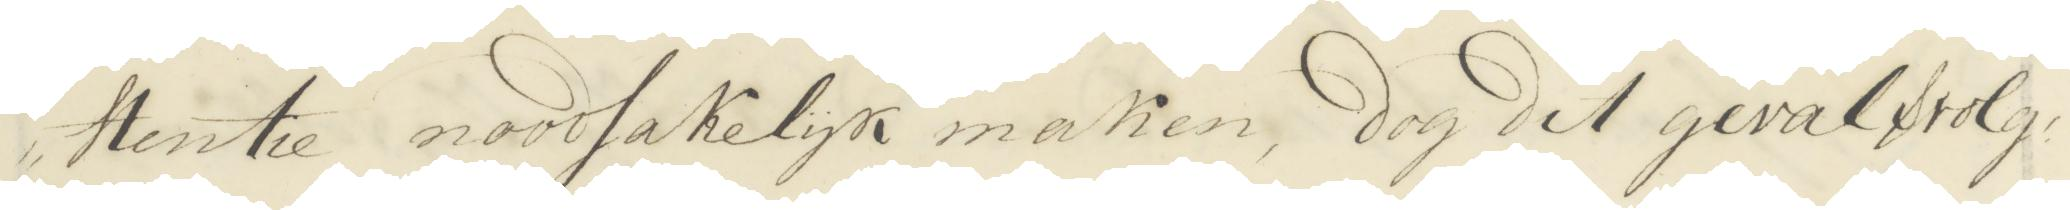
„stentie noodsakelijk maken, dog dit geval vervolg„
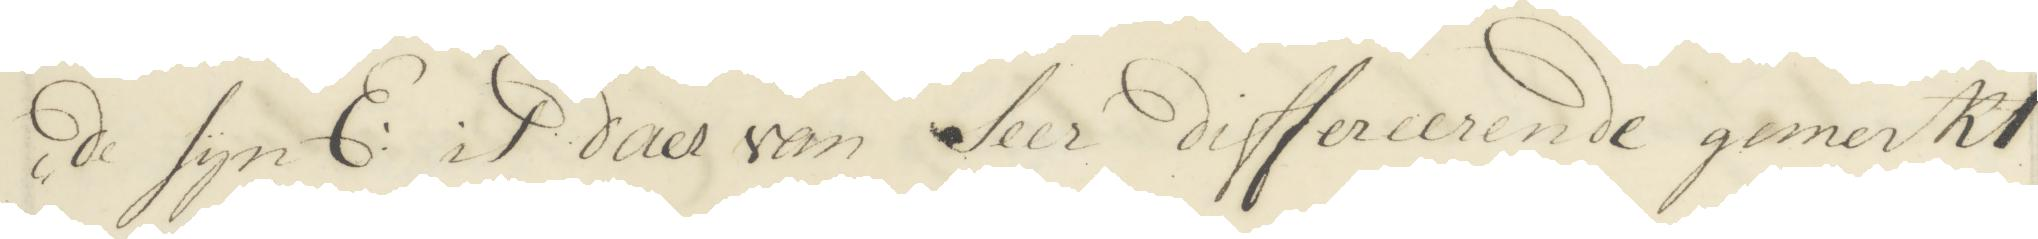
„de sijn E: is daer van seer differeerende gemerkt
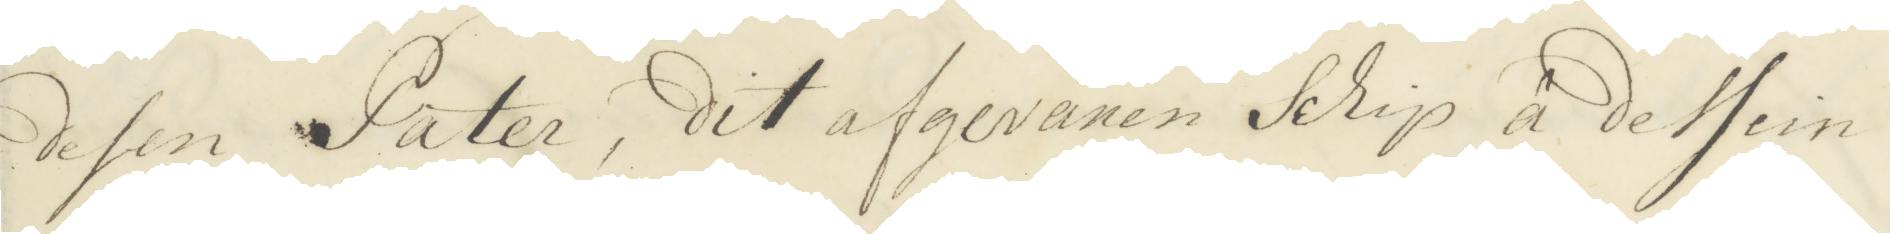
desen Pater, dit afgevaren schip â dessein
